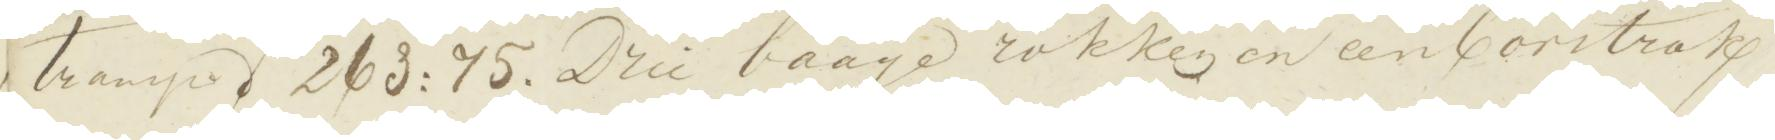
transp: ƒ 263:75. Drie baaye rokken en een borstrok
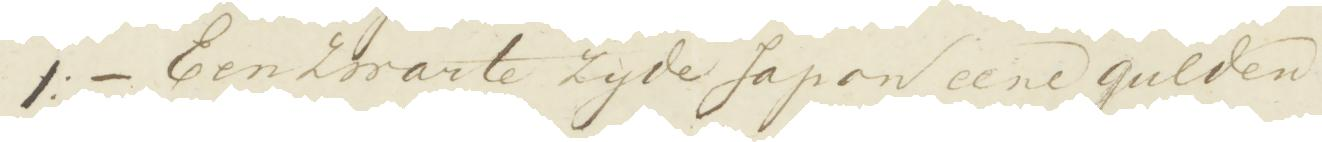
1:— Een zwarte zijde Japon eene gulden
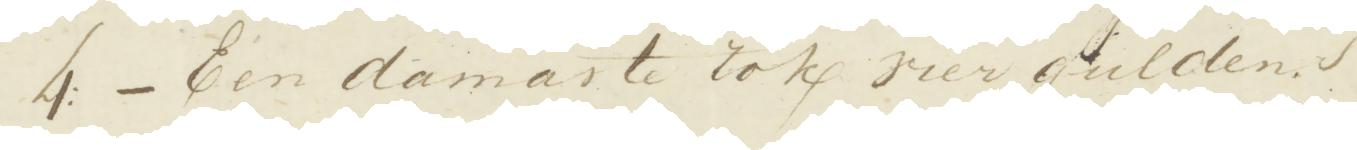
4: — Een damaste rok vier gulden.s
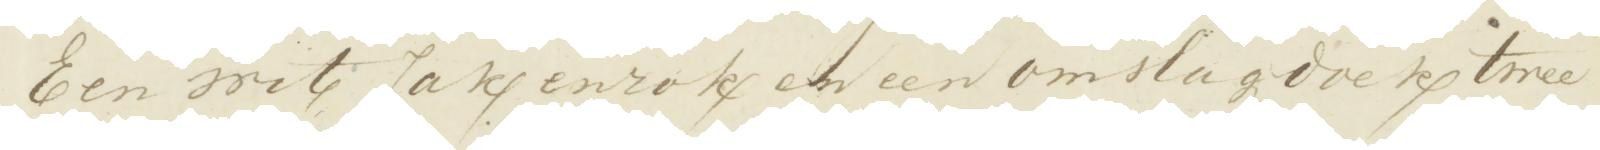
Een wit Jak en rok en een omslagdoek twee
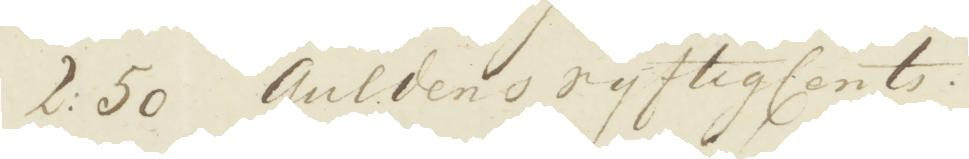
2:50 Guldens vijftig Cents.
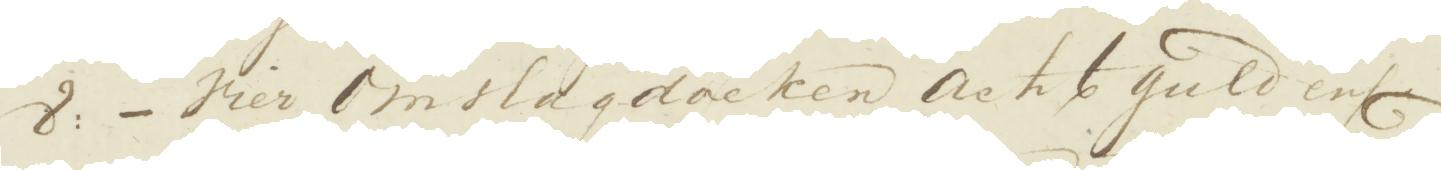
8: — Vier Omslagdoeken acht guldens.
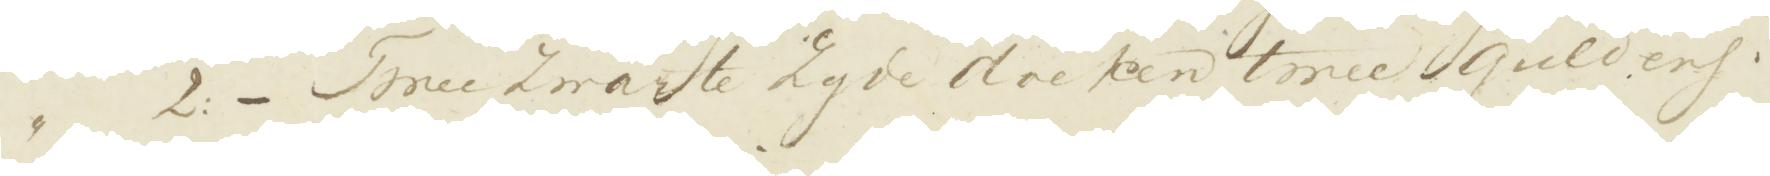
„ 2:— Twee zwarte zyde doeken twee guldens.
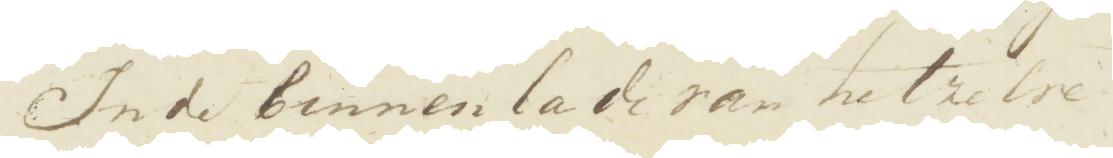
In de binnen lade van hetzelve
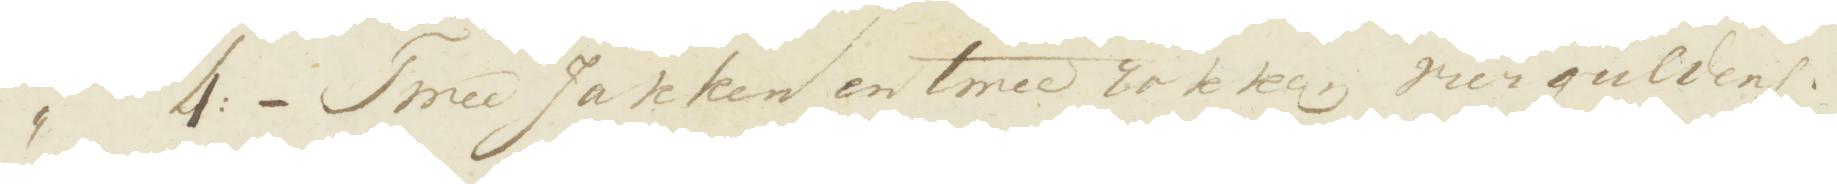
„ 4: — Twee Jakken en twee rokken vier guldens.
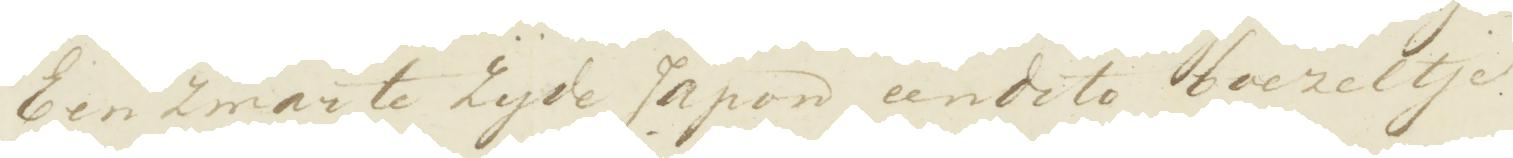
Een zwarte zyde Japon een dito boezeltje.
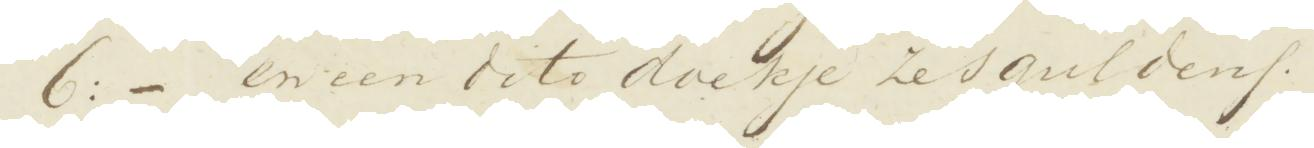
6: — en een dito doekje zes guldens.
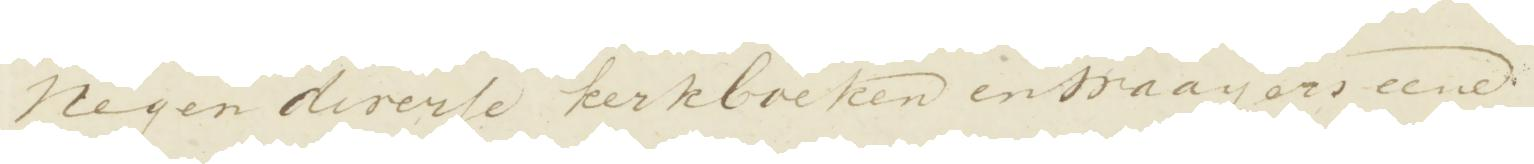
Negen diverse kerkboeken en waayers eene
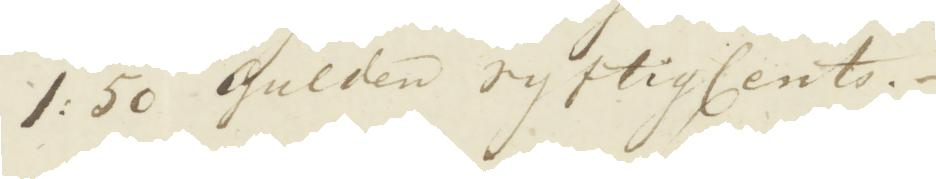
1: 50 gulden vyftig Cents.-
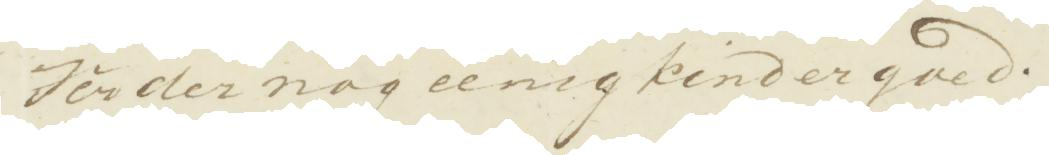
Verder nog eenig kindergoed.
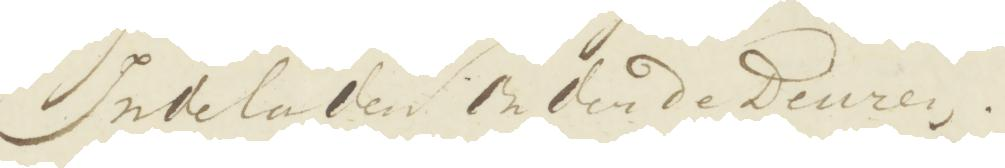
Jnde laden onder de Deuren,.
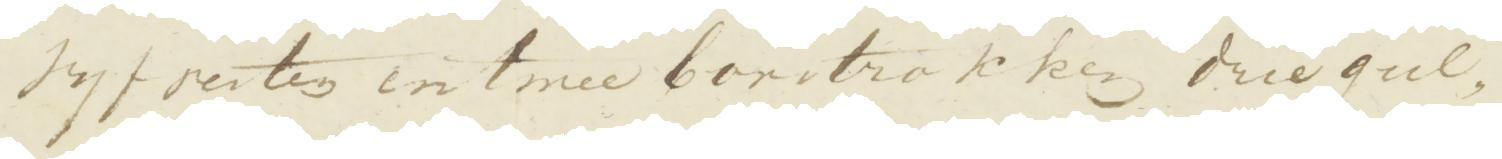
vyf vesten en twee borstrokken drie gul„
